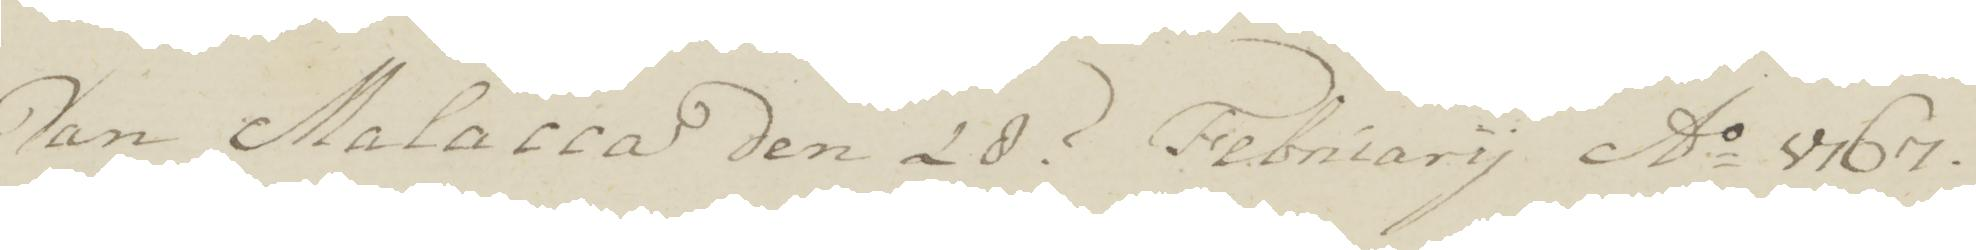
Van Malacca den 28.' Februarij A=o 1767.
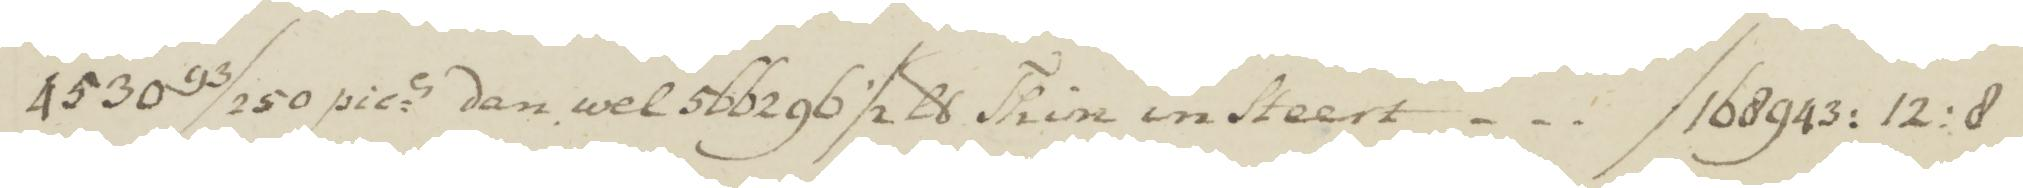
4530 93/250 pic=en dan wel 566296½ lb Thin in steert - - - ƒ168943:12: 8
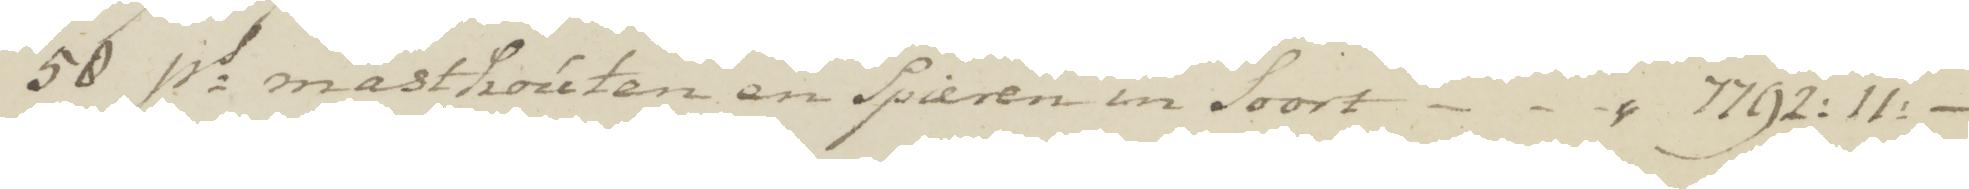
58 p=s masthouten en spieren in soort - - -„ 7792:11:-
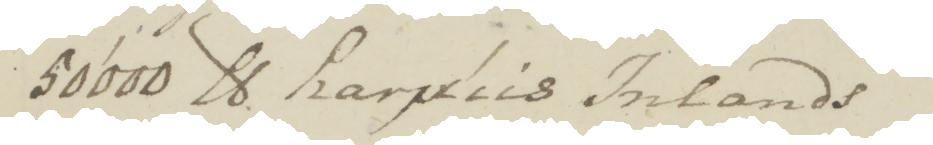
50000 lb. harpuis Inlands
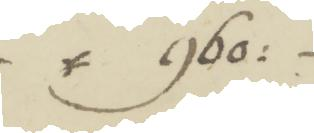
„ 960:
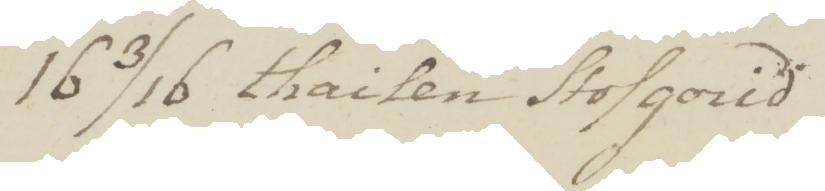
16 3/16 thailen stofgoud
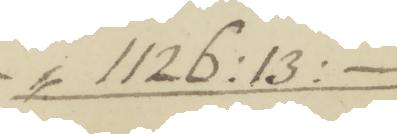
„ 1126:13:–
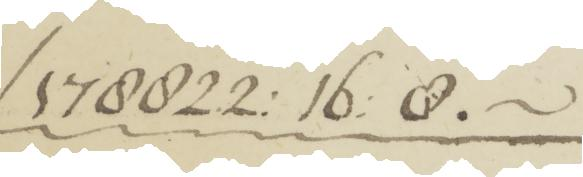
ƒ178822: 16: 8.—
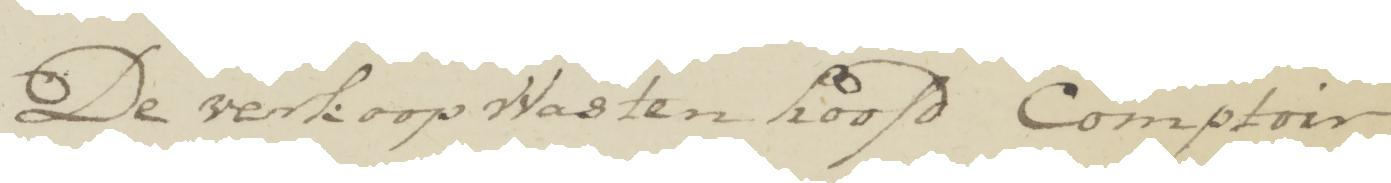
De verkoop was ten hoofd Comptoir
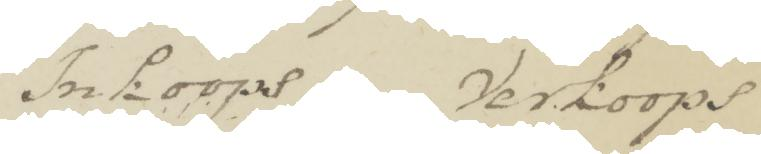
Inkoops Verkoops
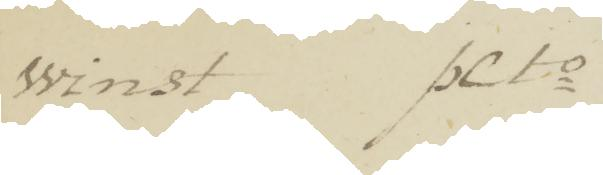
winst pct=o
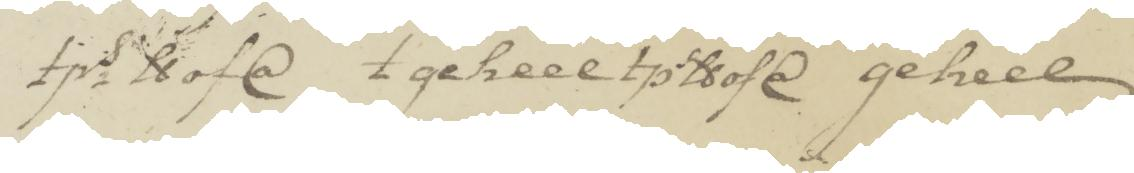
tp=s lb of @ t geheel tp lb of @ geheel
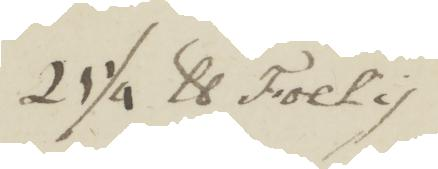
21¼ lb Foelij
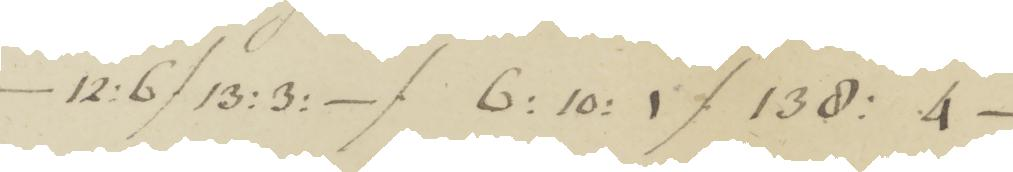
—12:6 ƒ 13:3:— ƒ 6: 10: 1 ƒ 138: 4 —
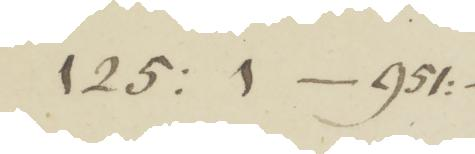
125: 1 — 951:–
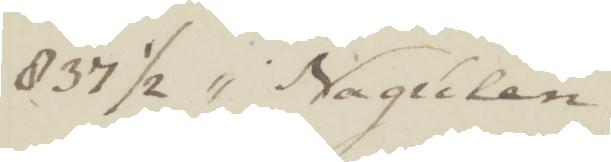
837½ „ Nagulen
